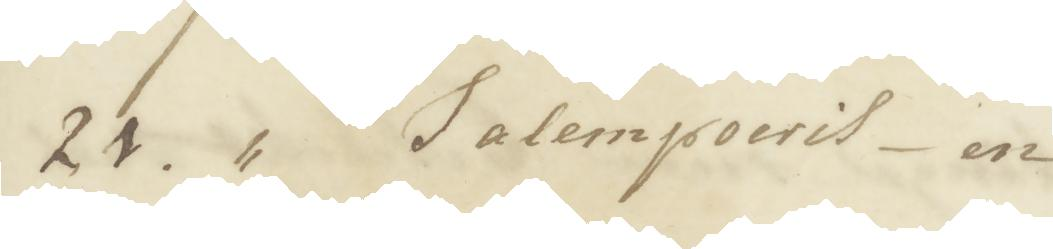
21. „ Salempoeris — en
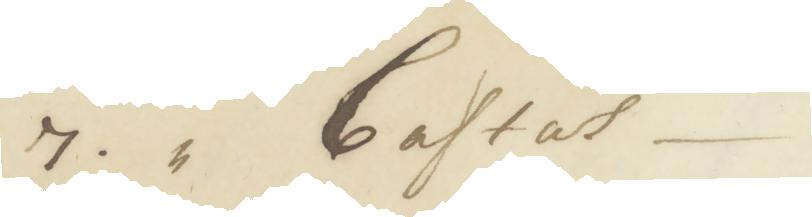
7. „ baftas —
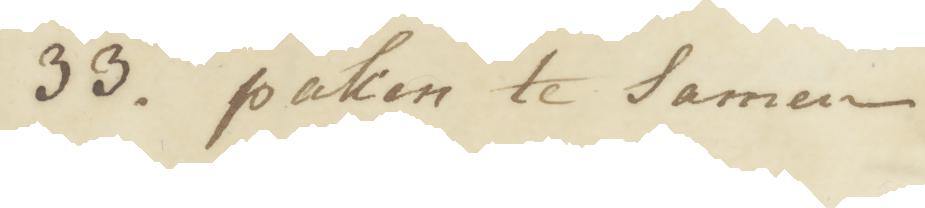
33. paken te samen
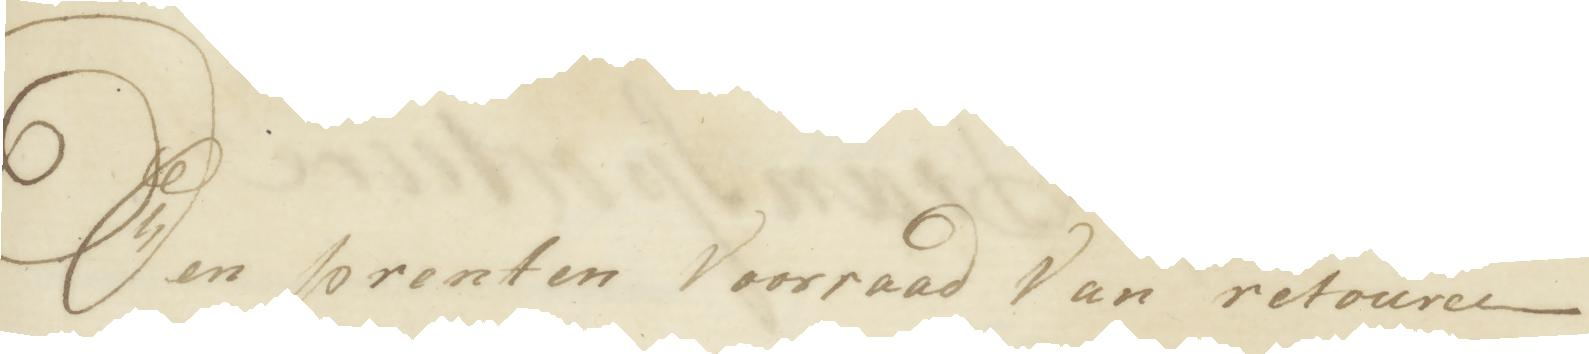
den prenten Voorraad Van retouren
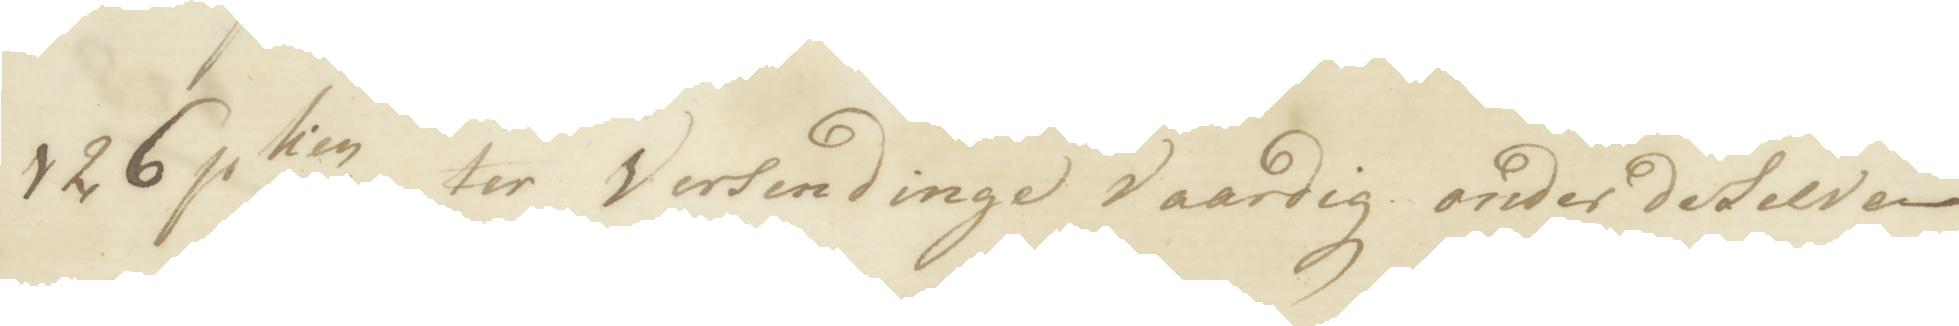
126 p=ken ter Versendinge Vaardig onder deselven
